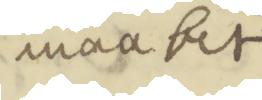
maakt
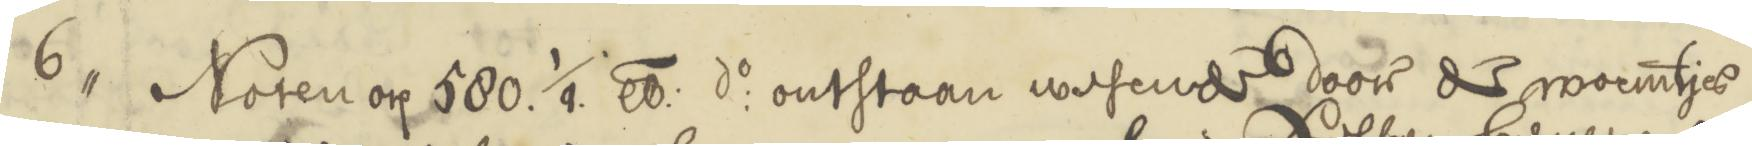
6„ Noten op 580.¼ lb: d:o ontstaan wesende door de wormtjes
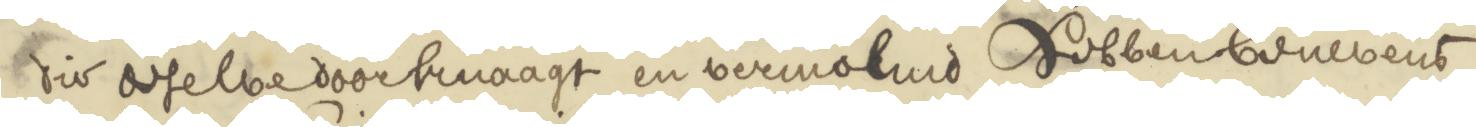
die deselve door knaagt en vermolmd hebben benevens
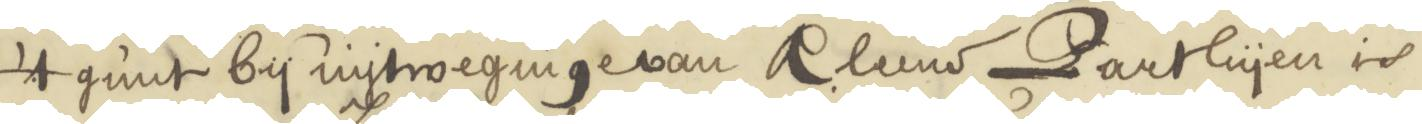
't gunt bij uijtweginge van Kleene Parthijen is
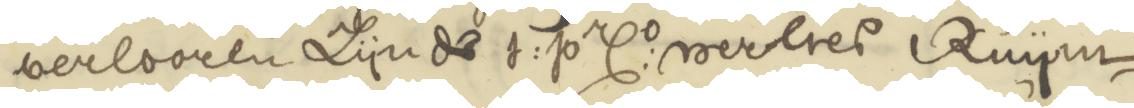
verlooren Zijn de 1: pr C:o verlies Ruijm
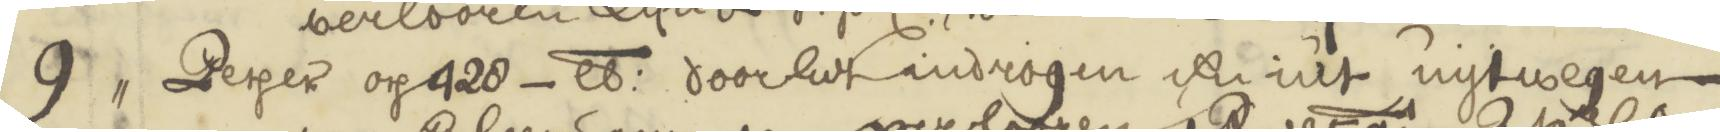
9 „ Peper op 428 - lb: door het indrogen en uit uijtwegen
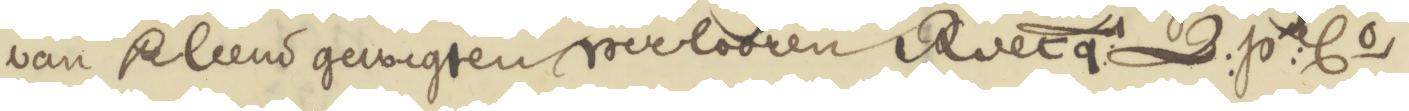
van kleene gewigten verlooren Reecq: 2: p:r C-o
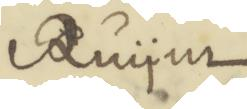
Ruijm
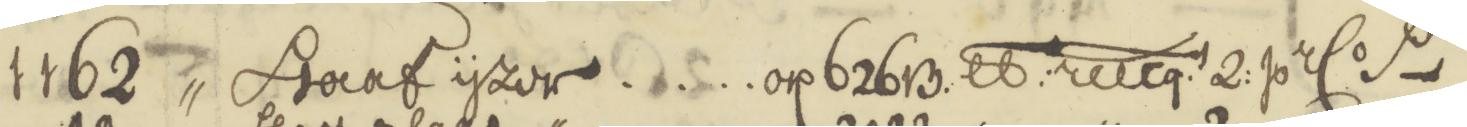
1162 „ Staaf ijzer. . . . . . . . . . . . . .op 62613. lb: reecq: 2: p:r C:o S:x-
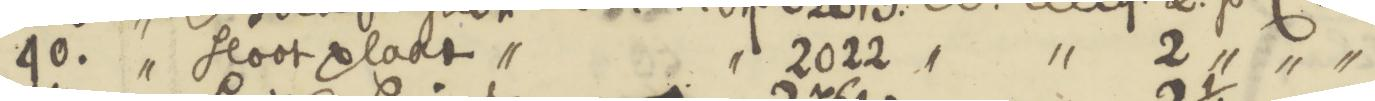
40. „ sloot plaat „ „ 2022 „ „ 2„ „ „
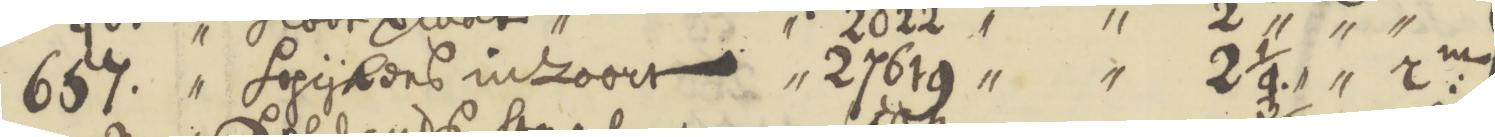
657. „ Spijkers inzoort „ 27619 „ „ 2¼. „ r:m
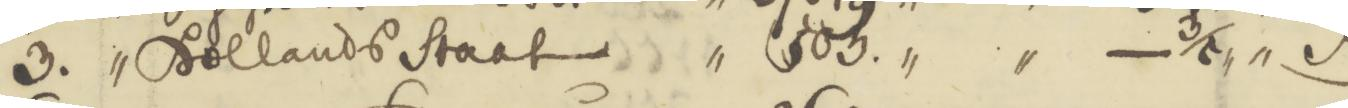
3. „ Hollands staal „ 503.„ „ — 3/5 „ „ S:s
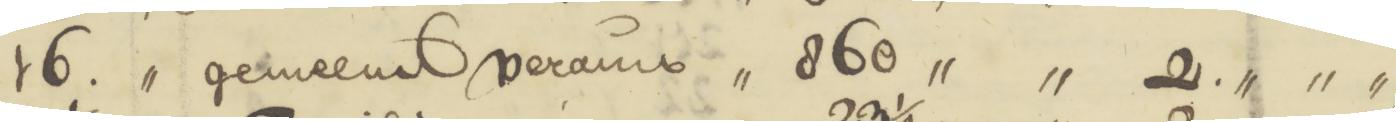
16. „ gemeene verauw „ 860 „ „ 2. „ „ „
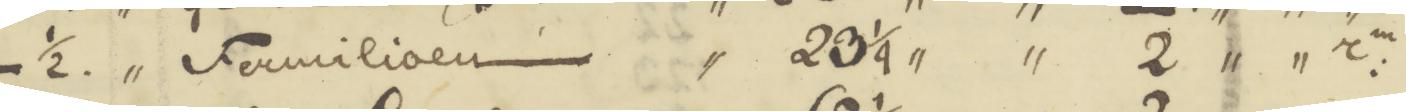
- ½. „ Fermilioen „ 23¼„ „ 2„ „ r:m
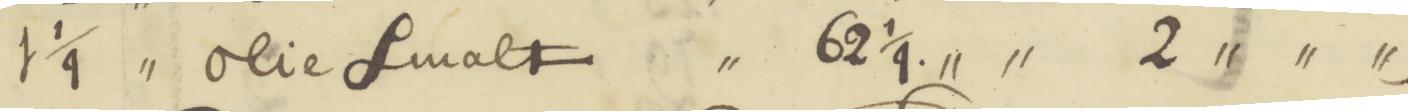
1¼ „ olie smalt „ 62¼.„ „ 2 „ „ „
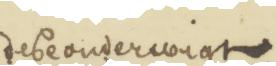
dese onderwigt
